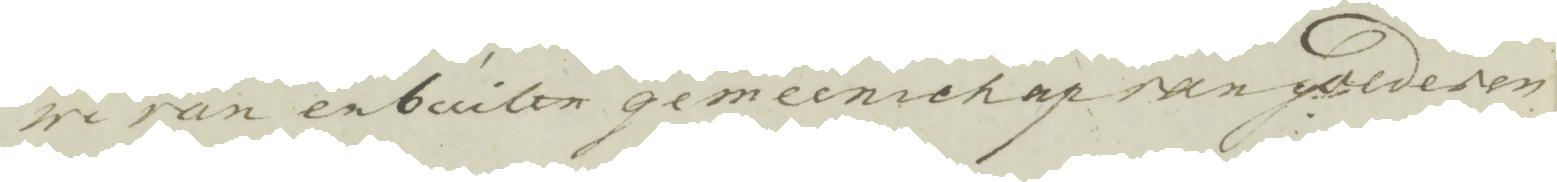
we van en buiten gemeenschap van goederen
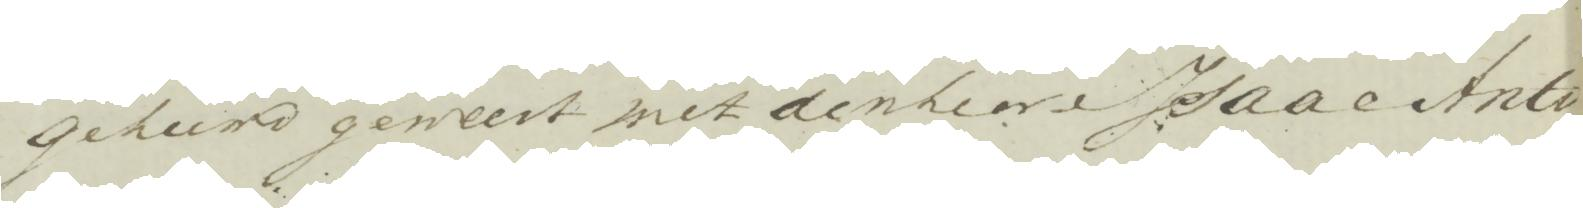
gehuwd geweest met den heere Jsaac Anto
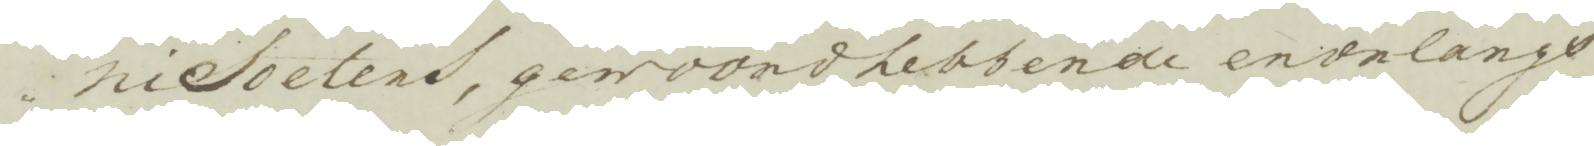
„ni Soetens, gewoond hebbende en onlangs
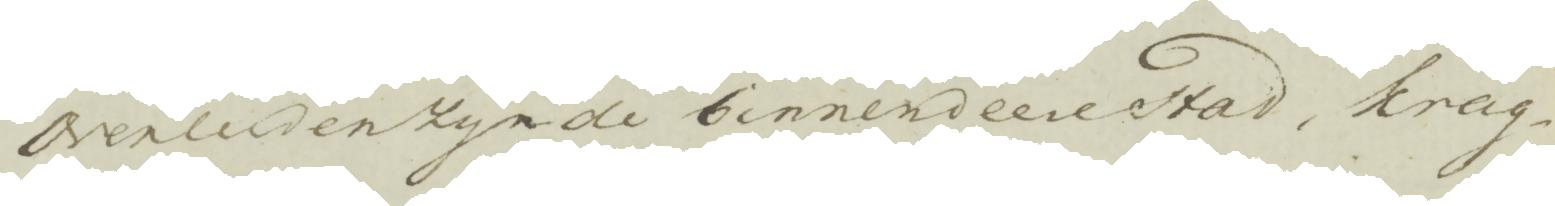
overleeden zijnde binnen deese Stad, krag„
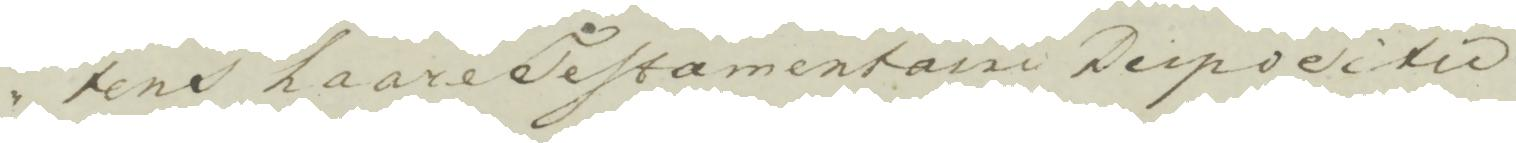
„tens haare Testamentaire Dispositie
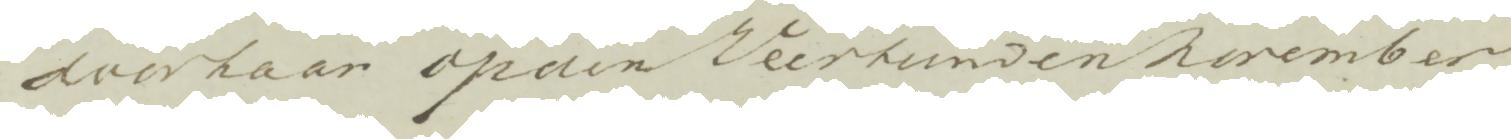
door haar op den Veertienden November
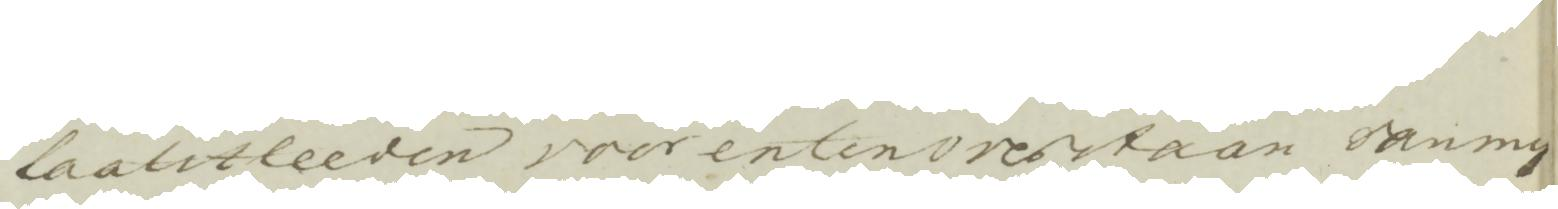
laatstleeden voor en ten overstaan van my
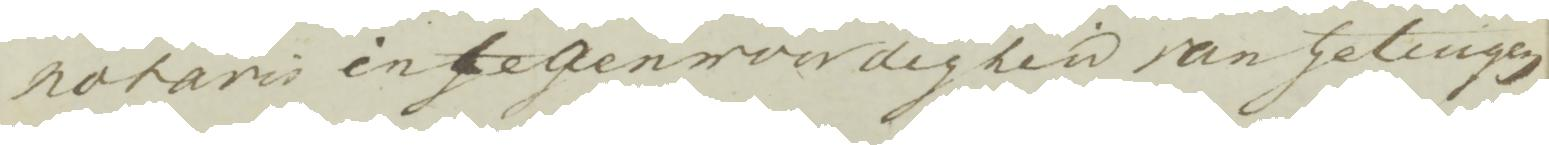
notaris in tegenwoordigheid van getuigen
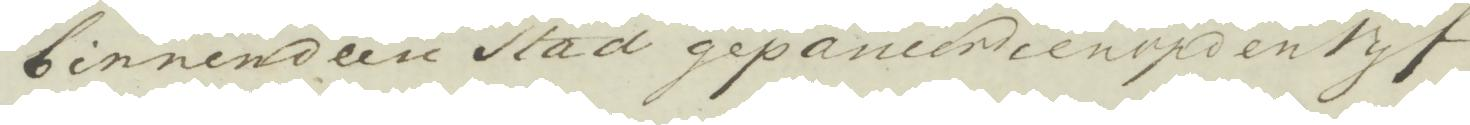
binnen deese stad gepaneerd en op den vyf
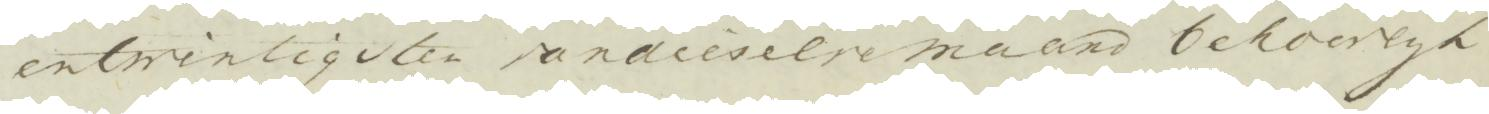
en twintigsten van dieselve maard behoorlyk
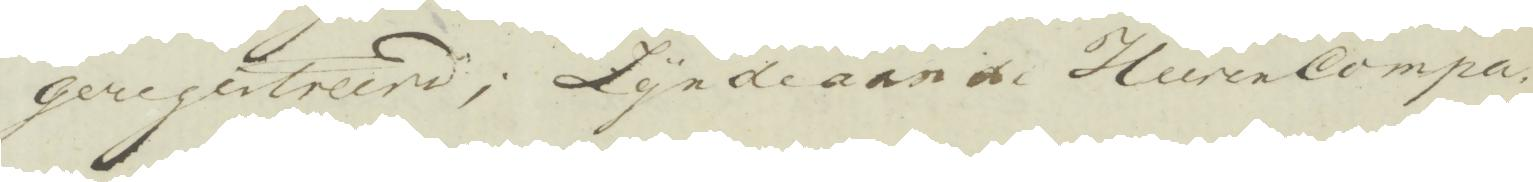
geregistreerd; Zijnde aan de Heeren Compa„
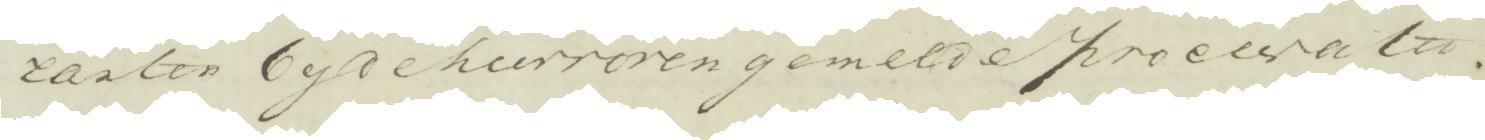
ranten by de hiervoren gemelde procuratie
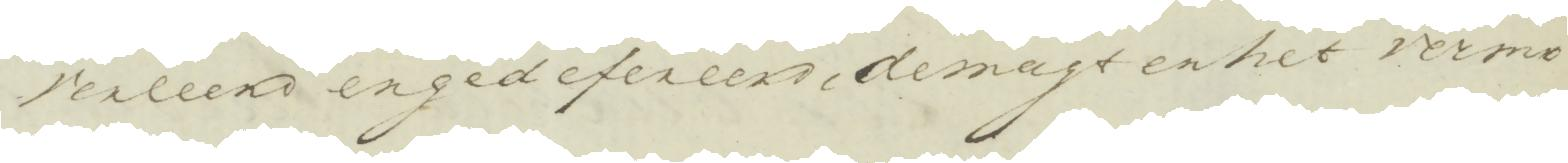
verleend en gedefereerd, de magt en het vermo
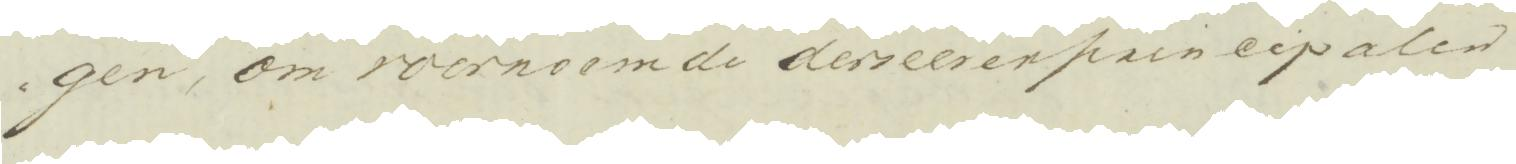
„gen, om voornoemde derselven principalen
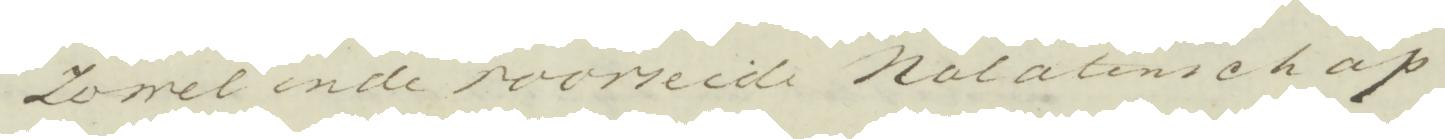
Zowel inde voorseide Nalatenschap
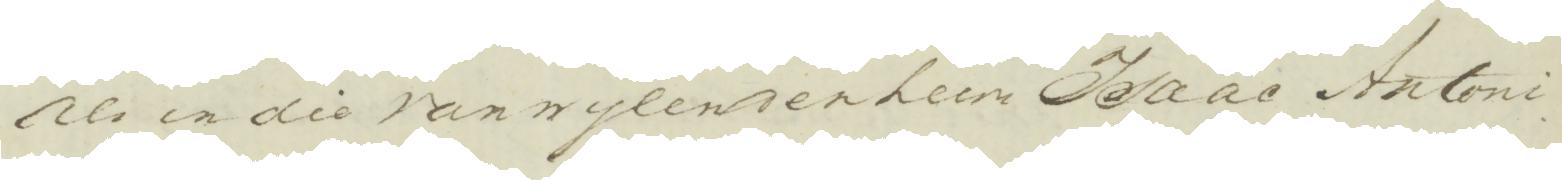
als in die van wylen den heere Isaac Antoni
